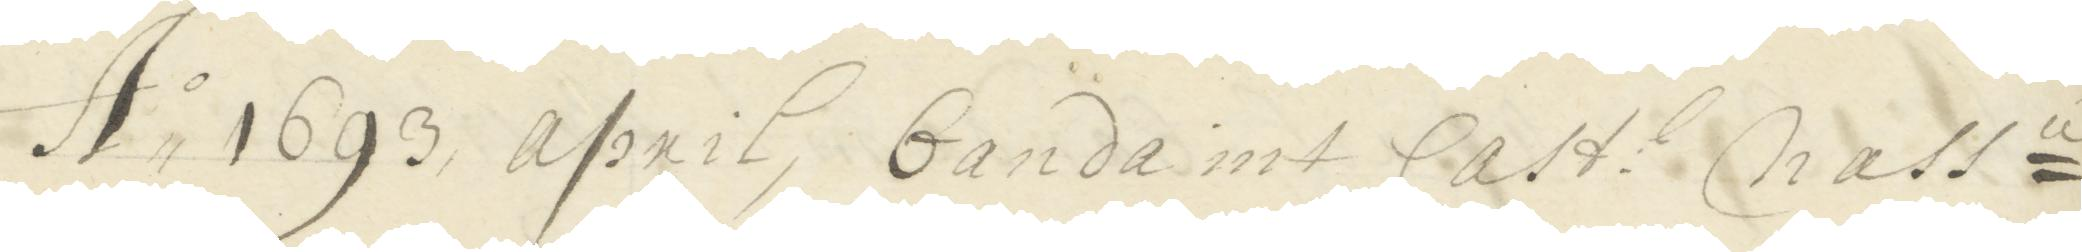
A„o 1693, april, banda int Cast:l nass=w
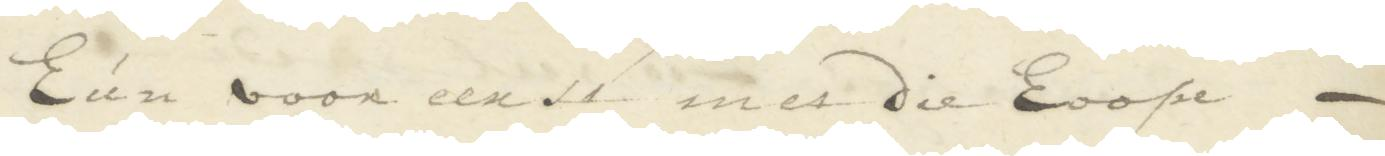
hun voor eerst met die hoope —
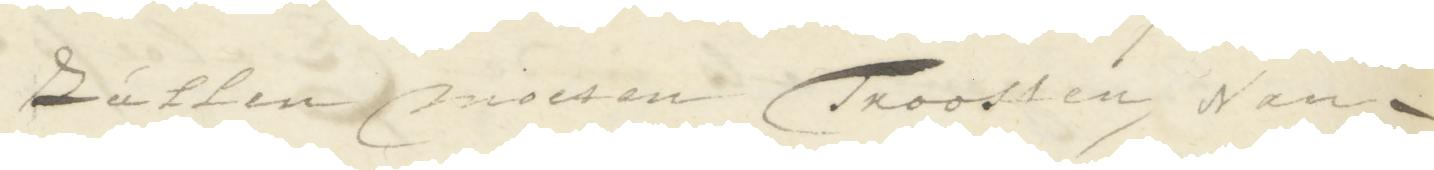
zullen moeten Troosten, van —
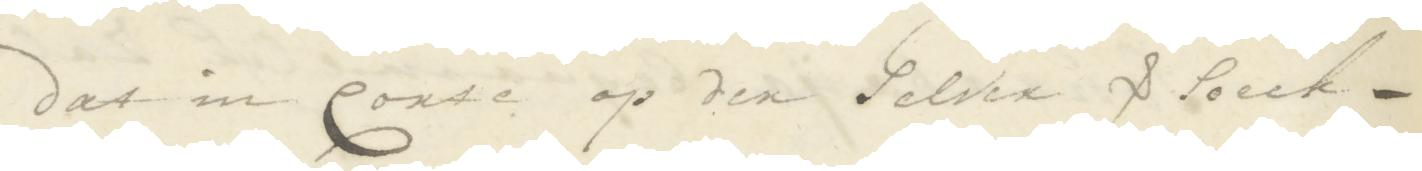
dat in corte op der selver versoeck —
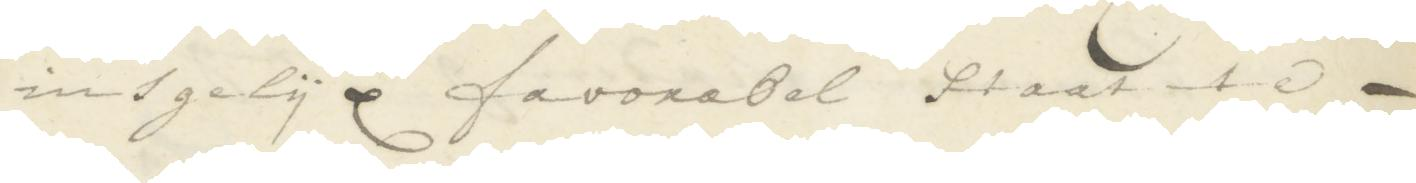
insgelijx favorabel staat te —
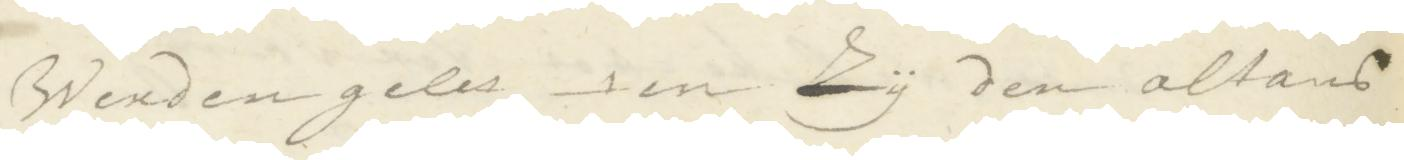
werden gelet, ten zij den altans
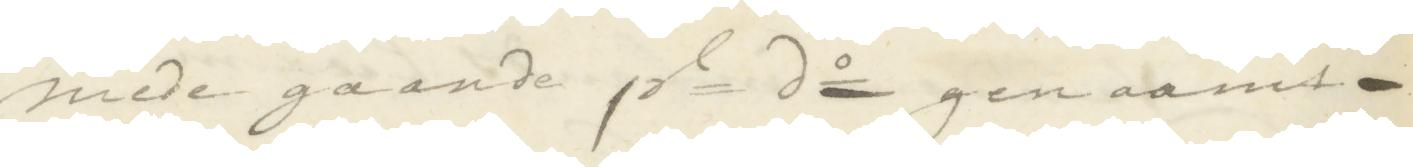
mede gaande p=l d=o genaamt —
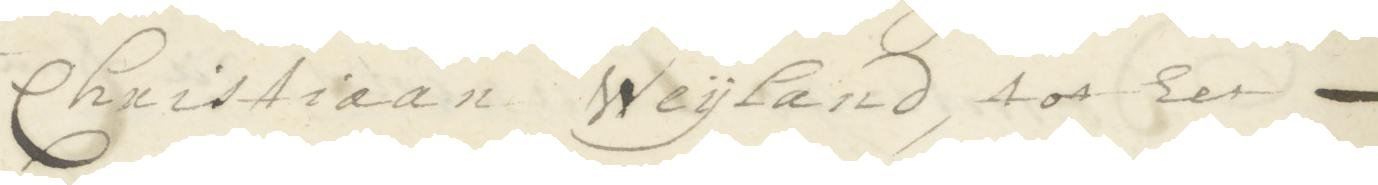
Christiaan Weijland, tot het —
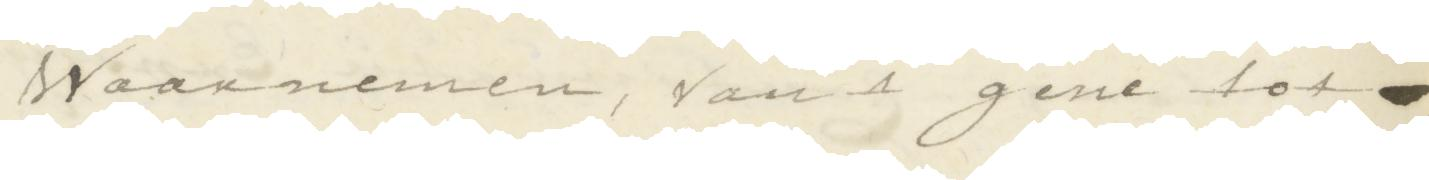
waarnemen, van 't gene tot —
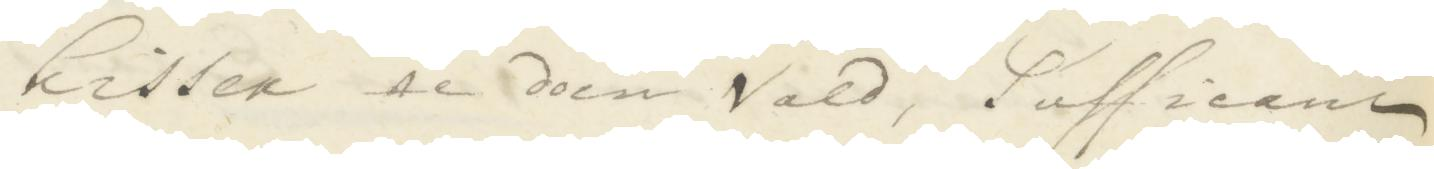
kisser te doen vald, sufficant
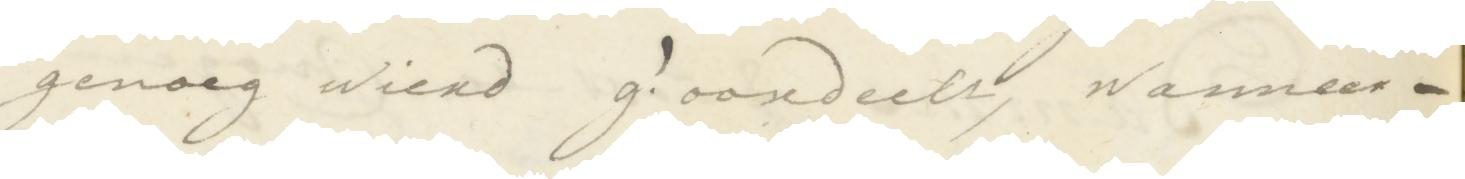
genoeg wierd g’oordeelt, wanneer —
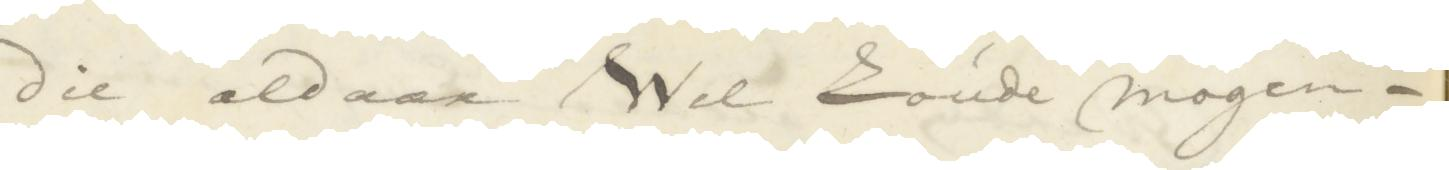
die aldaar Wel zoude mogen —
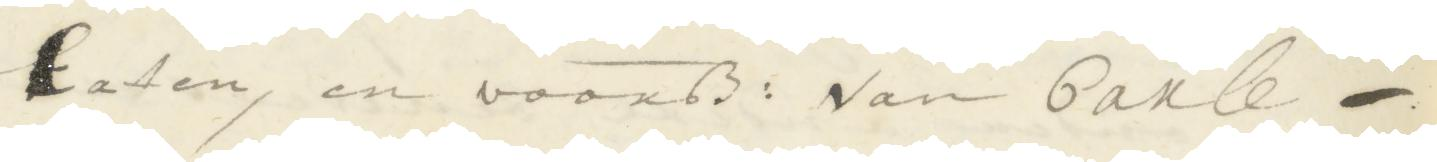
laten, en voorsz: van barle —
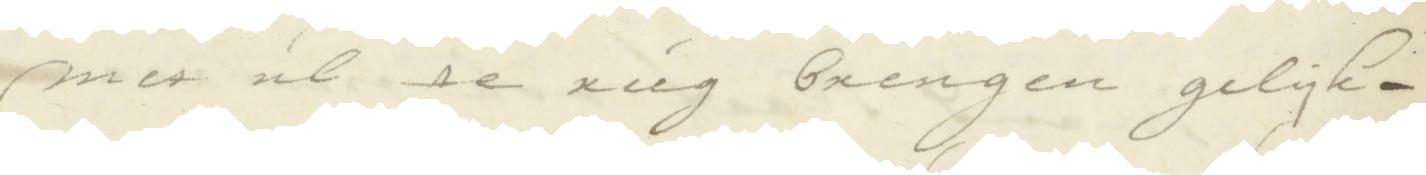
met ul te rug brengen gelijk —
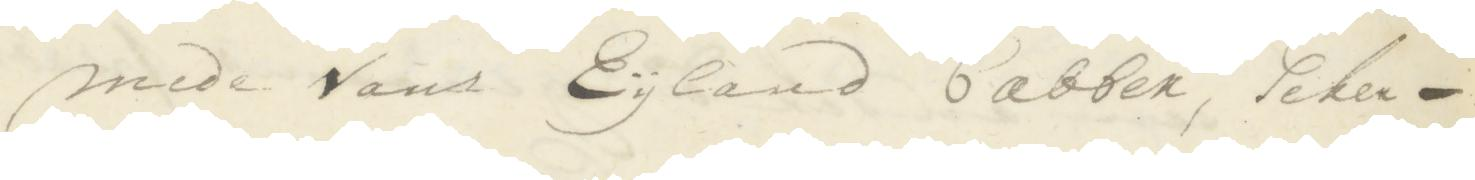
mede vant Eijland babber, seker —
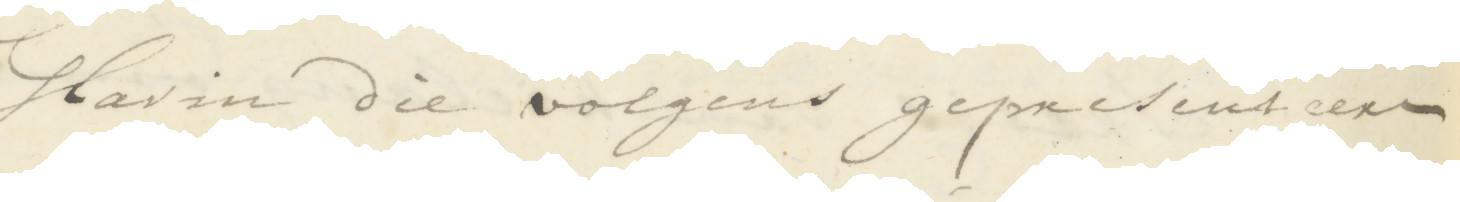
slavin die volgens gepresenteert
